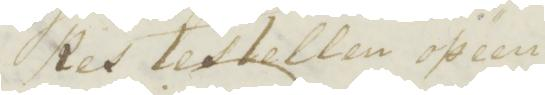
Kes testellen op een
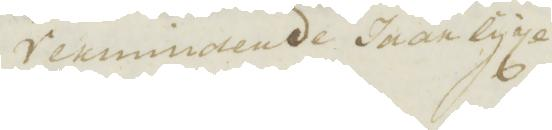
vermindende. jaar lijxe
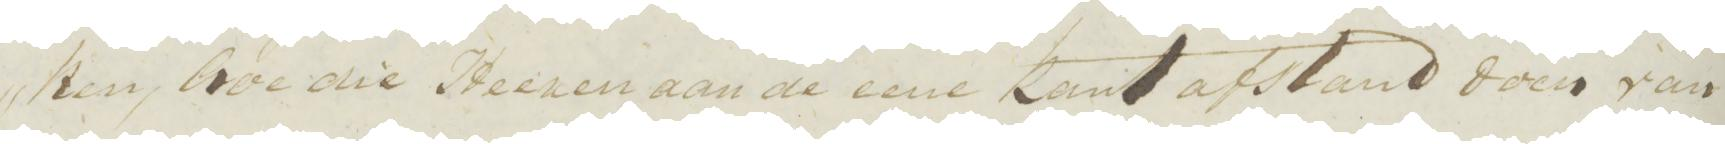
ken, boeie Heeren aan de eene konmt afsland doen van
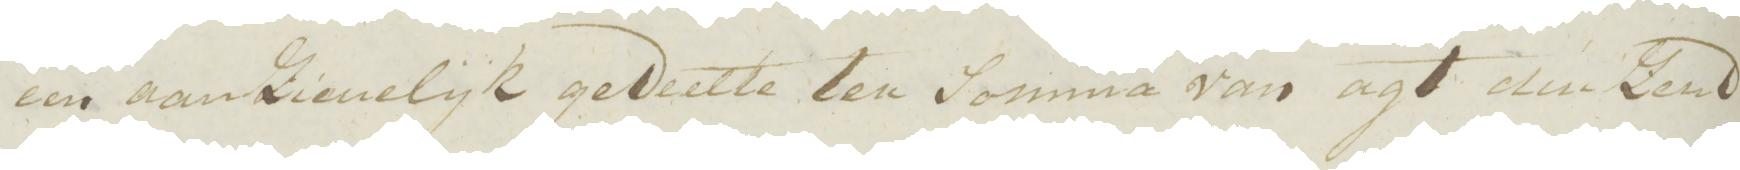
een aanzienelijk gedeelte ter somma van agt den zend
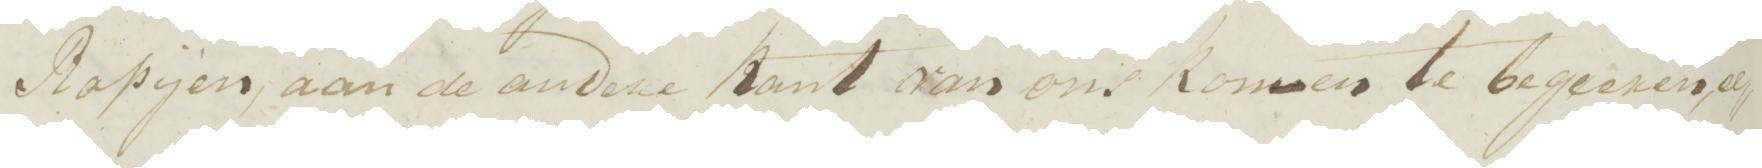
rapijen, aan de andere sdant van ons komen te begeeren, een
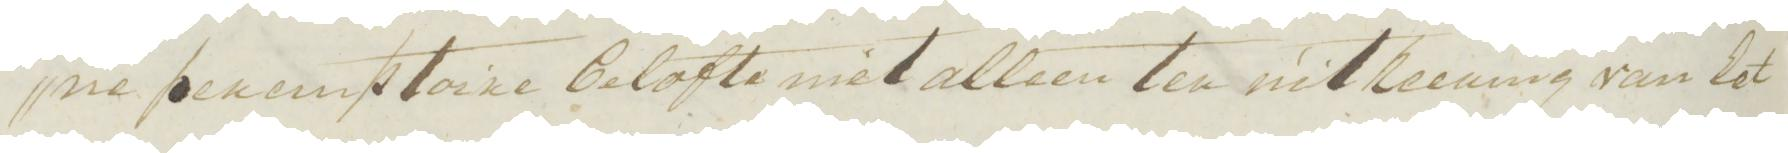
ne peremptoire belofte niet alleen ten in’t heening van he
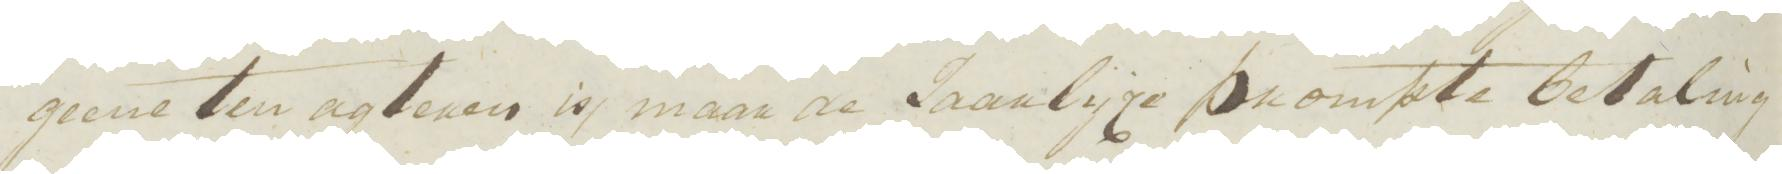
geene ten agteren is, maar de Zaarlijxe prompte betalmij
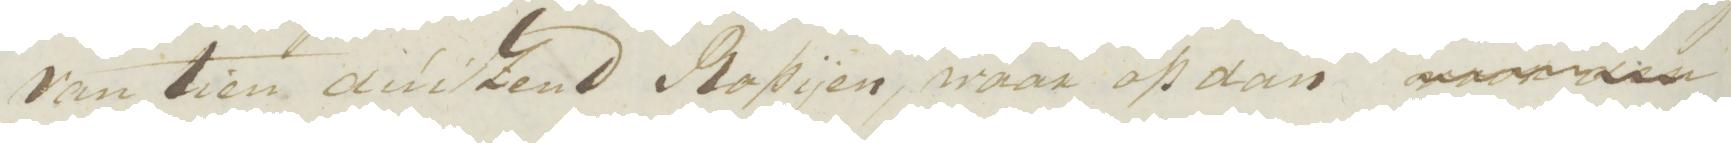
van tien duijzend ropijen, waar op aan voen
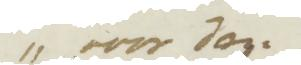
voor don
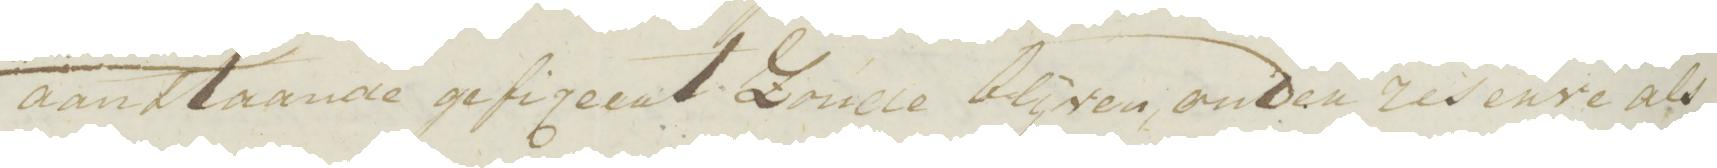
aanstaande gesigeent Zoutie blijven, onder res erve als
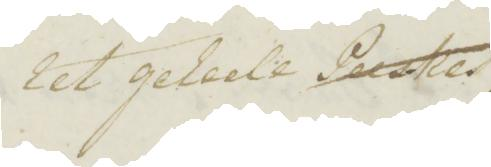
het geheele lotster
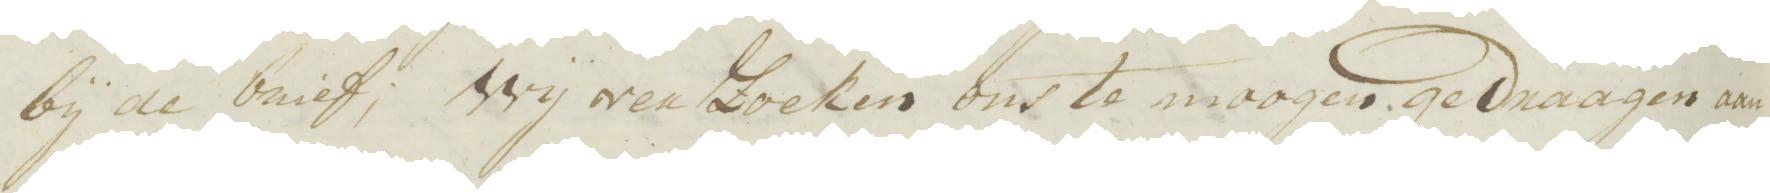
bij de brief; wij verzoeken ons te moogen gedraagen aan
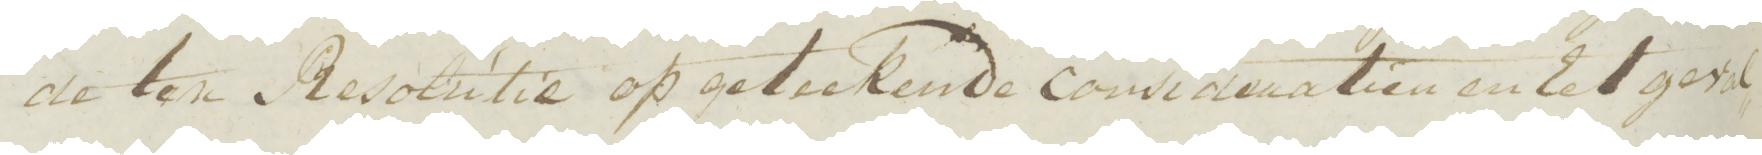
de ter resolutie op geteekende conianatien in het geve
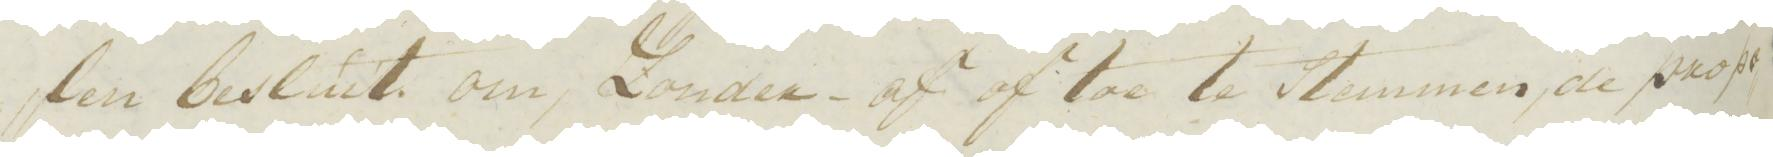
len besluit om, zonderaf of toe te stemmen, de prost
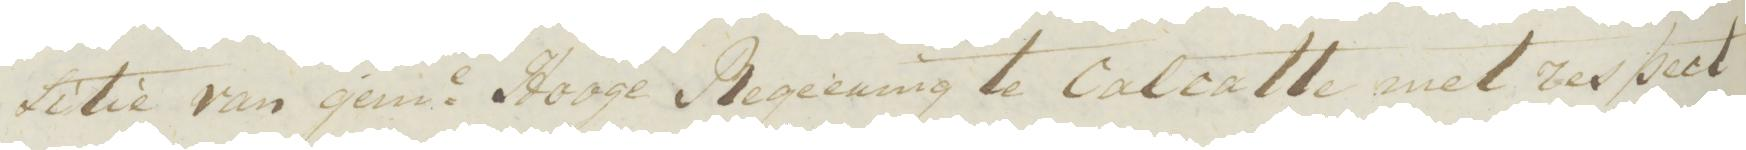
sitie van gem:e dooge regeening te calcatte met des heed
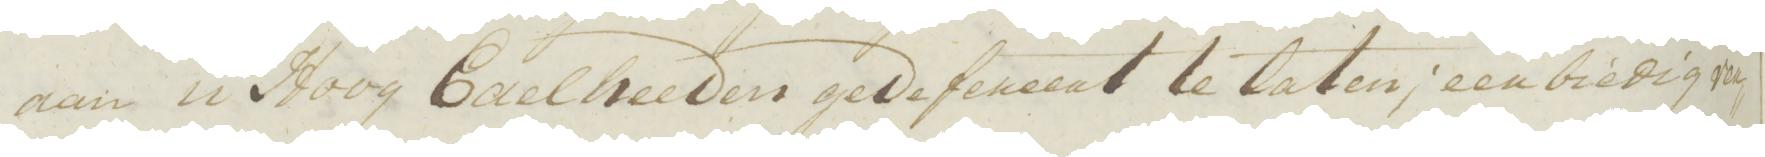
aan u Hoog Eaelheeden gedefereert te laten; een biedighen
